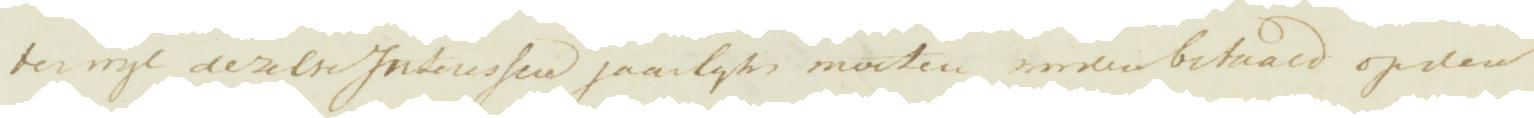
terwyl dezelve Jnteressen jaarlyks moeten worden betaald op den
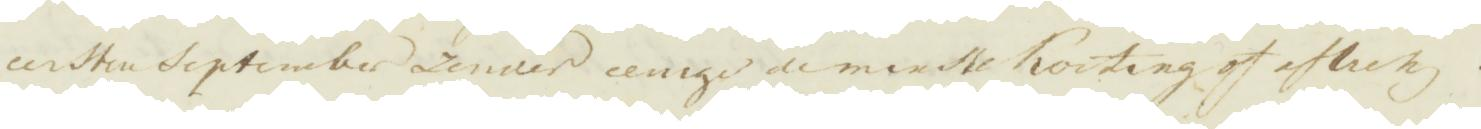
eersten september zonder eenige de minste Korting of aftrek
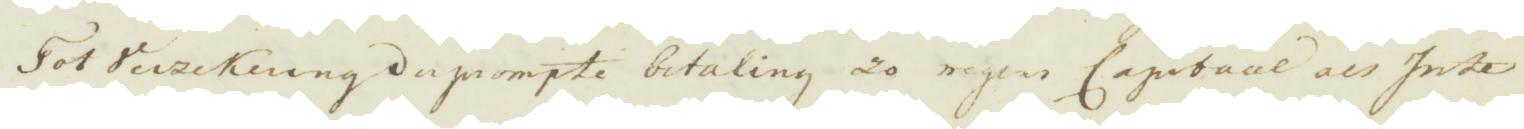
Tot Verzekering der prompte betaling zo wegens Capitaal als Jnte
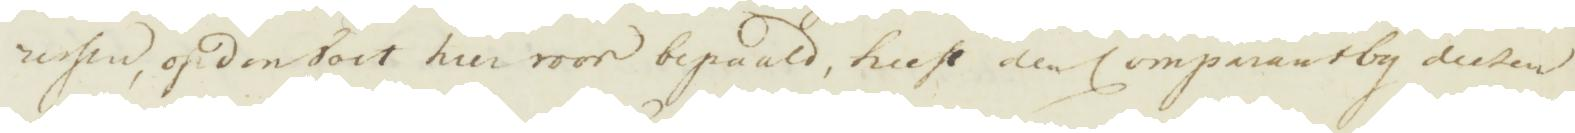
ressen, op den voet hier voor bepaald, heeft den Comparant by deezen
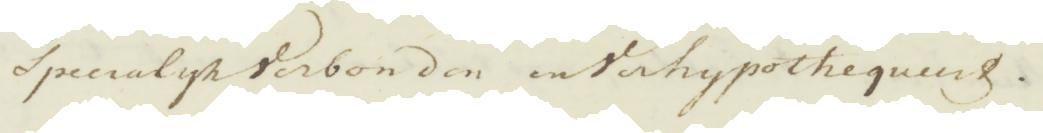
specialyk verbonden en verhypothequeert.
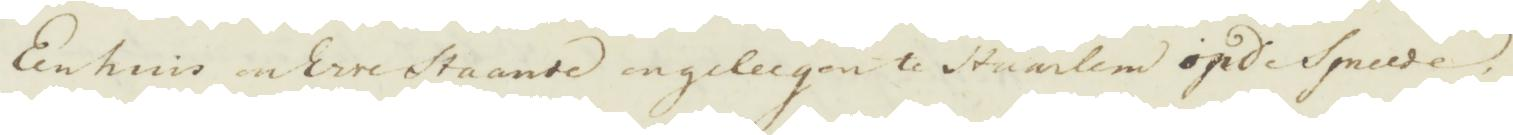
Een huis en Erve staande en geleegen te Haarlem op de Smeede,
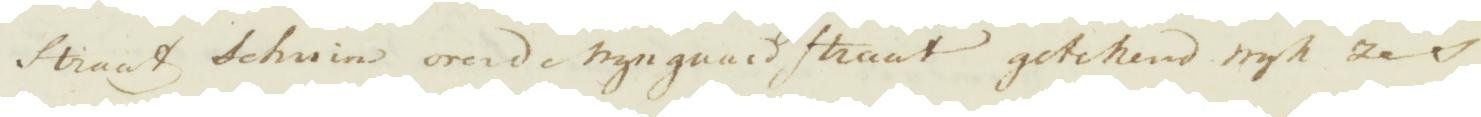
straat, schuin over de wyngaard straat getekend wyk zes
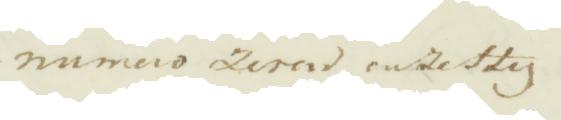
numero zeven en zestig
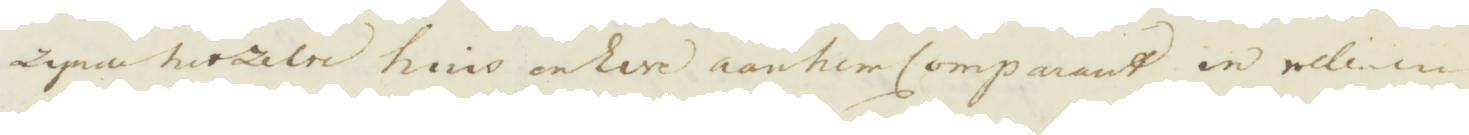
zynde hetzelve huis en Erve aan hem Comparant in vollen en
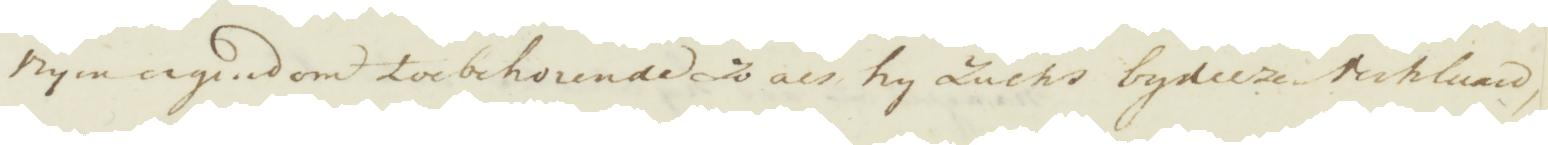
vryen eigendom toebehorende zo als hy zulks by deeze verklaard,
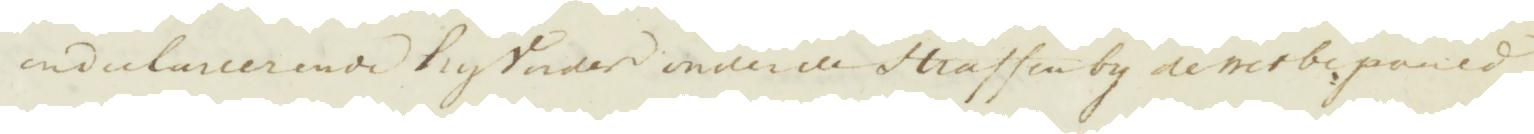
en declarerende hy Verder onder de straffen by de wet bepaald
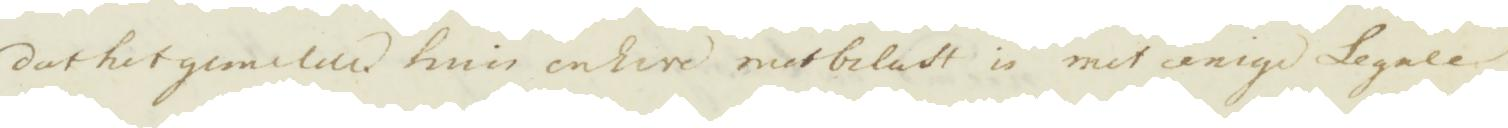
dat het gemelde huis en Erve niet belast is met eenige Legale
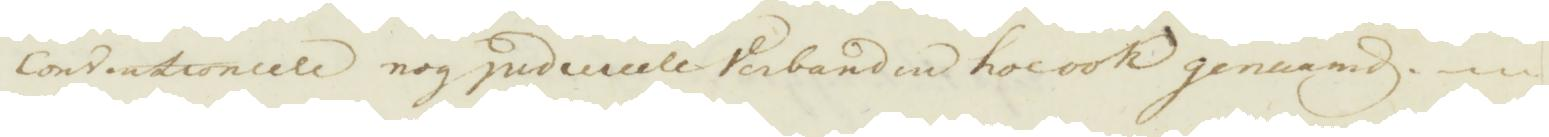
conventioneele nog judicieele Verbanden hoe ook genaamd.
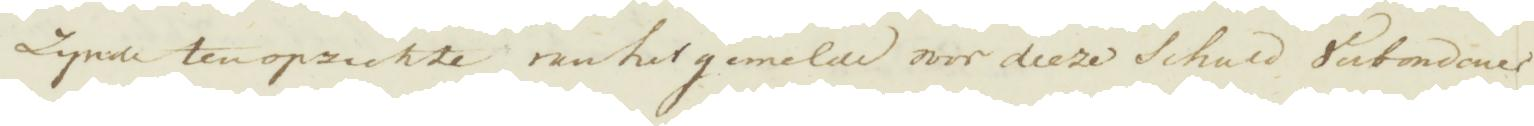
Zynde ten opzichte van het gemelde voor deeze schuld Verbondene
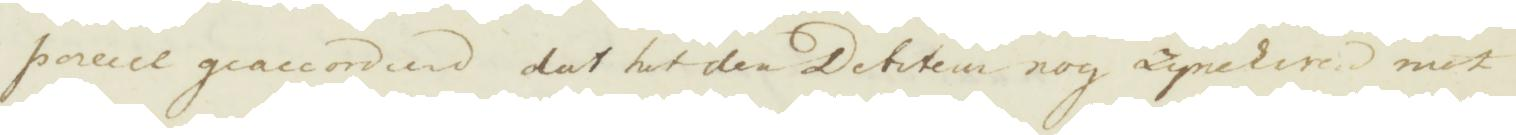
perceel geaccordeerd dat het den Debiteur nog zyne Erven niet
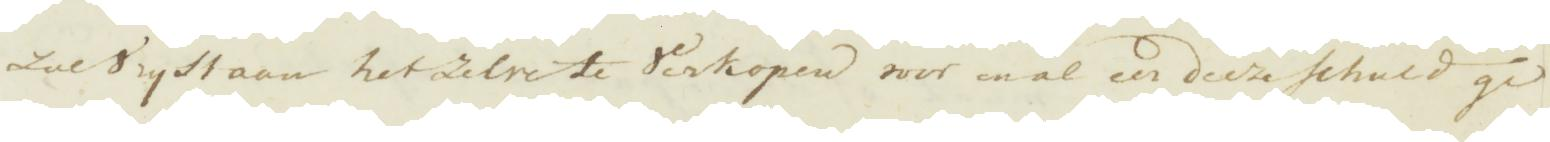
zal vrystaan het zelve te verkopen voor en al eer deeze schuld ge
